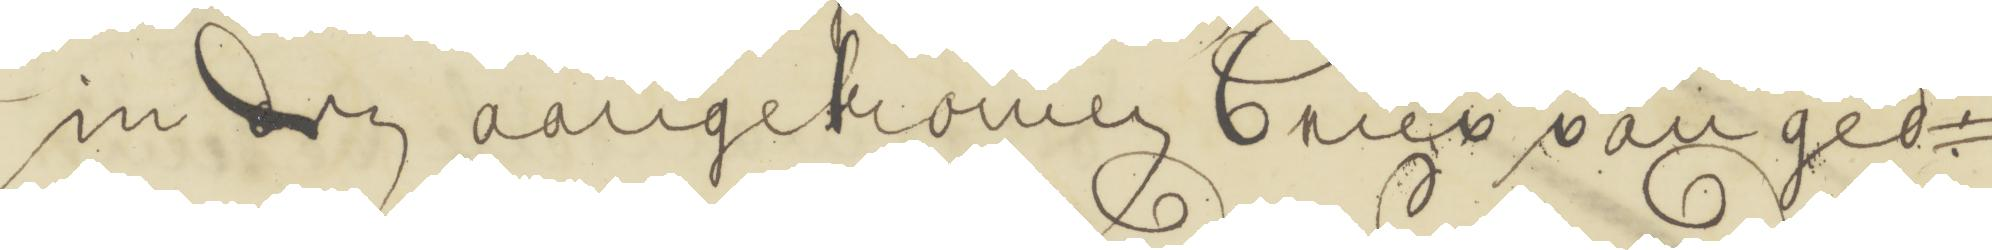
in den aangekomen briev van ged:te
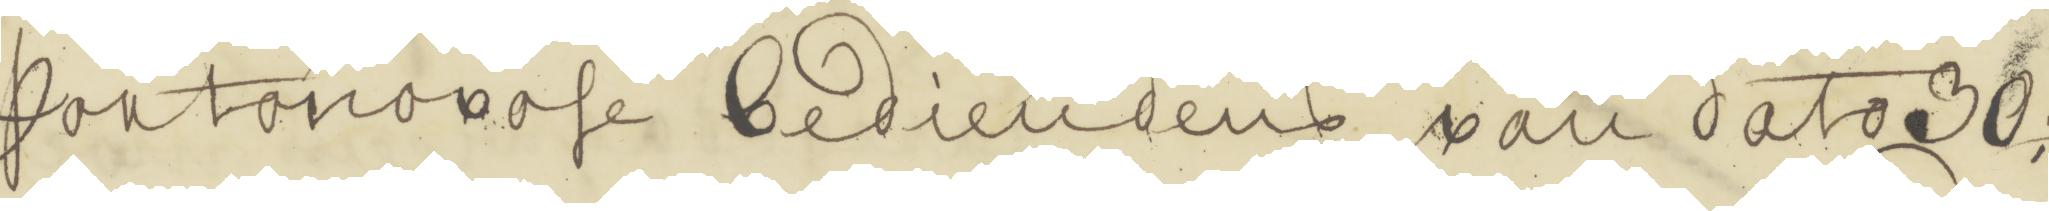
Portonovose bediendens, van dato 30.
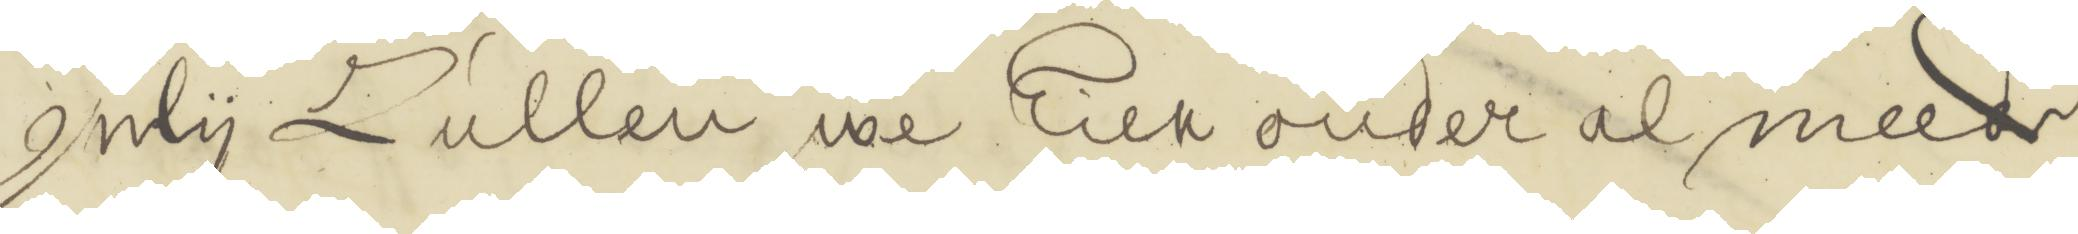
julij zullen we hier onder al meede
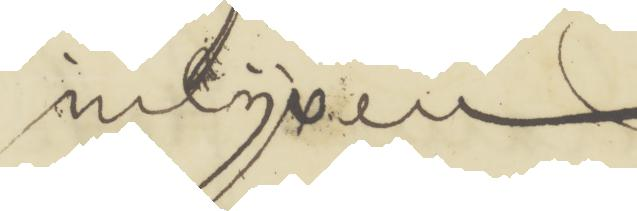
inlijven
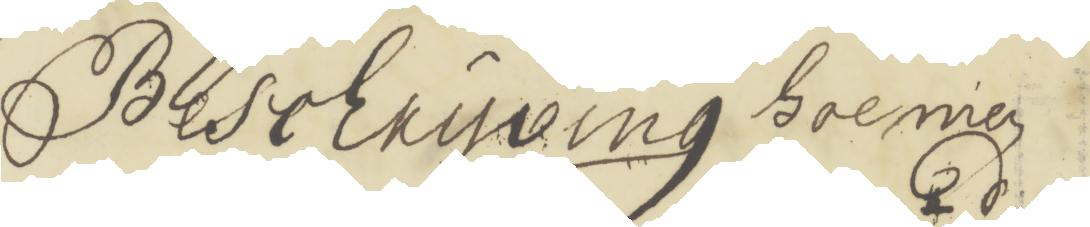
Beschrijving hoe men
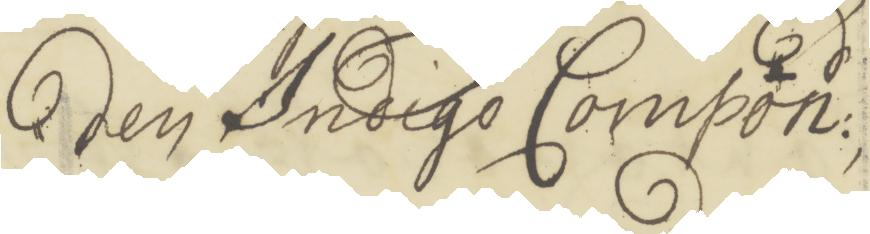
den Indigo Compon:d,
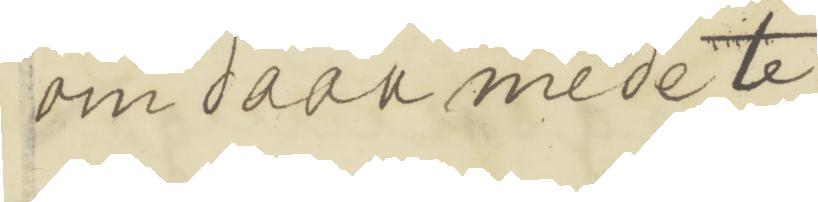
om daar mede te
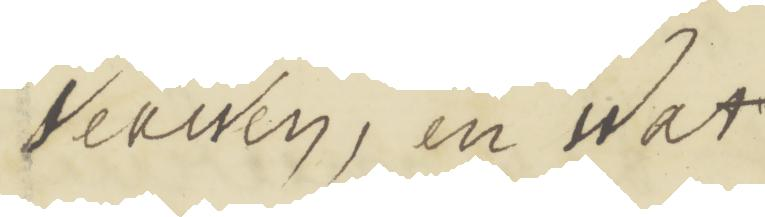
verwen, en wat
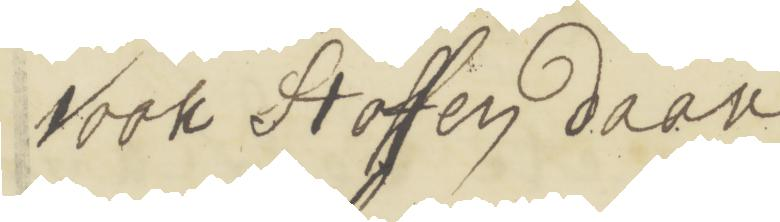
voor stoffen daar
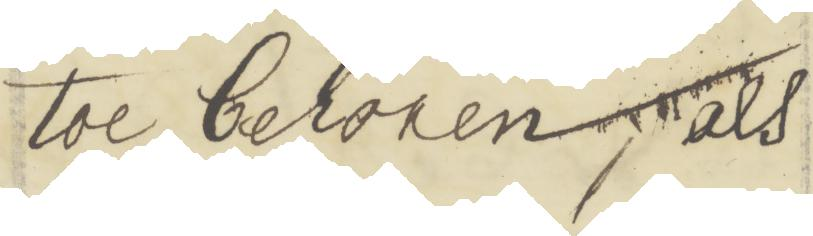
toe behoren, als
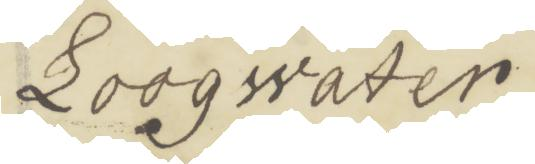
Loogwater.
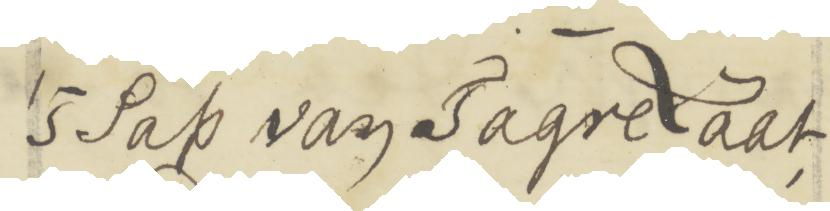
's sap van Tagre Zaat,
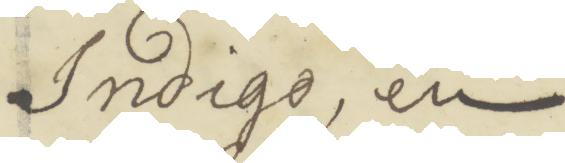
Indigo, en
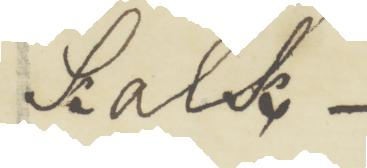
kalk —
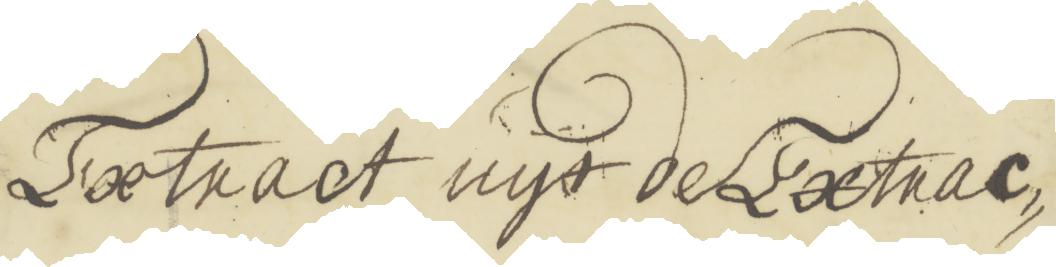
Extract uijt de Extrac„
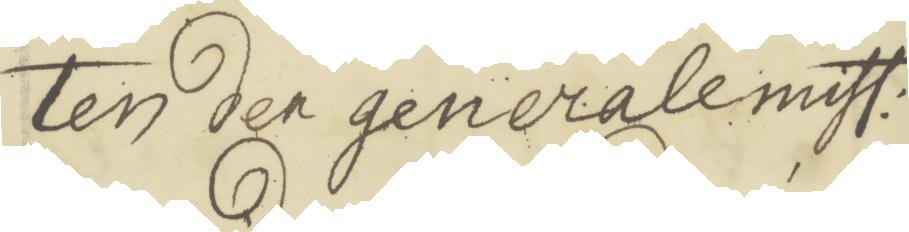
ten der generale miss:
